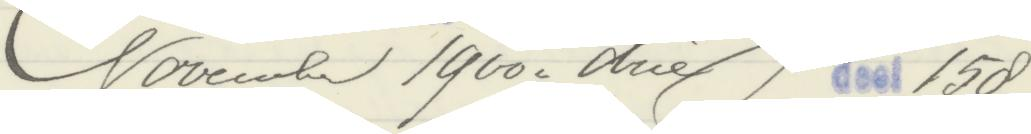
November 1900 en drie
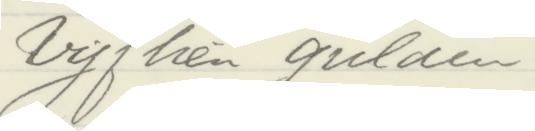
Vijftien gulden
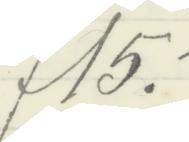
ƒ15.
